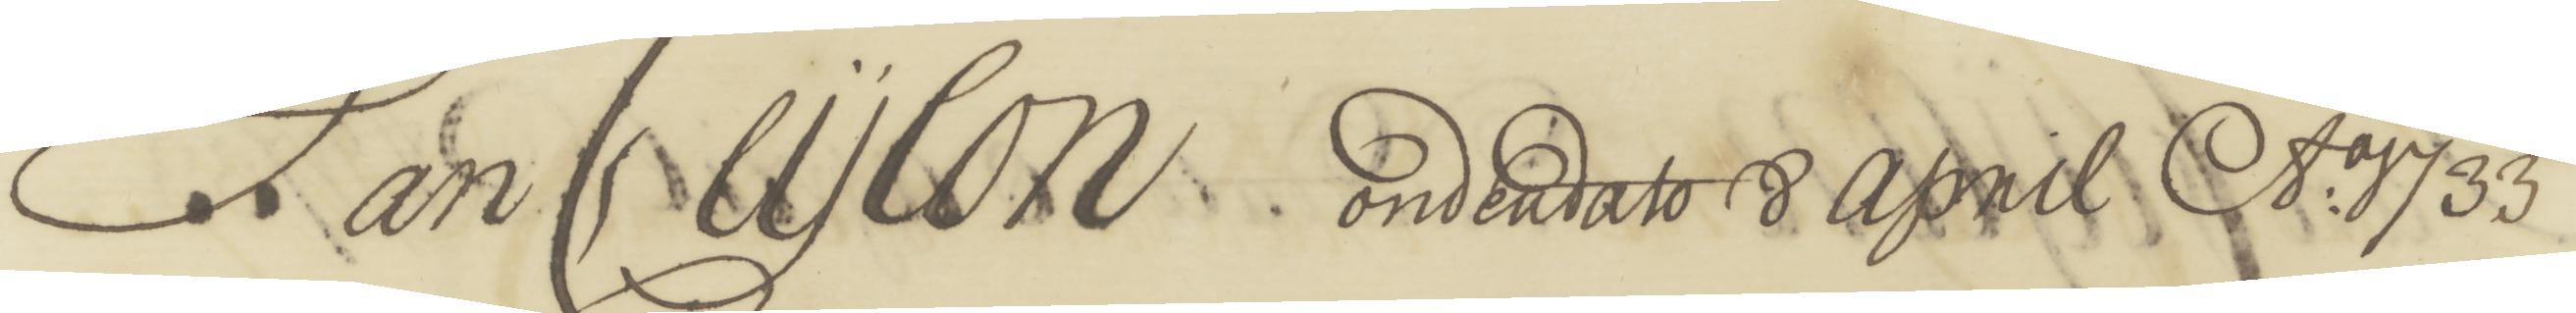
Van Ceijlon onder dato 8 April A:o 1733
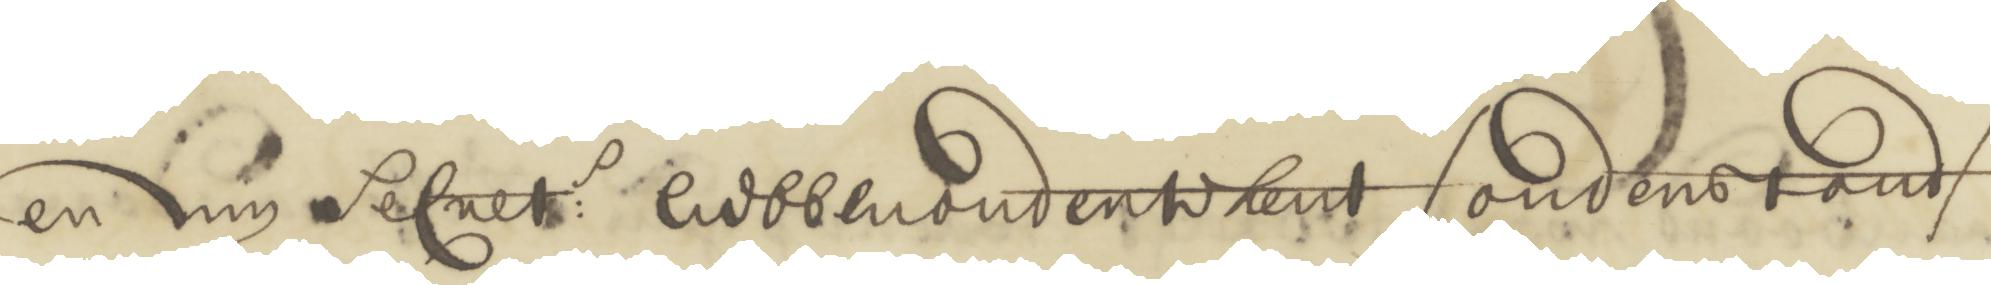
en my secret:s hebben onder tekent /onderstond/
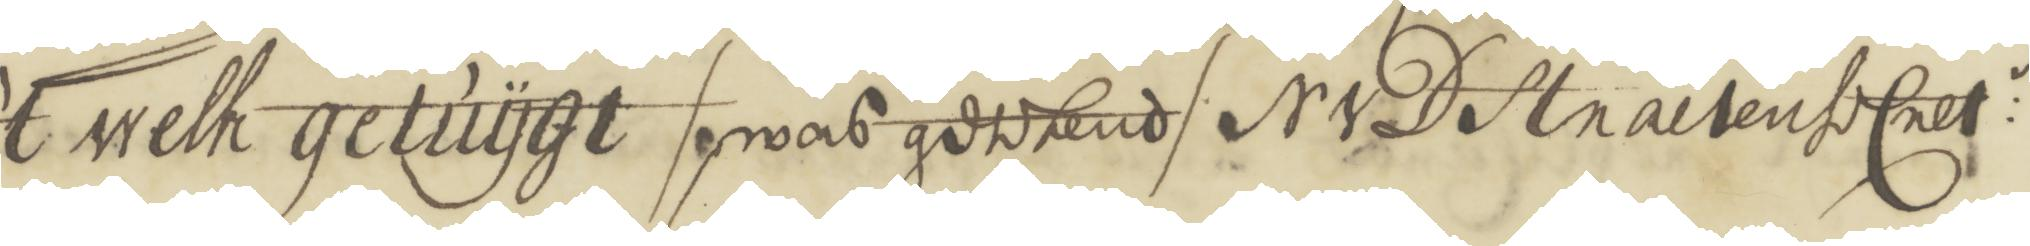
’t welk getuijgt /:was getekend:/ N V D Straeten secret:s
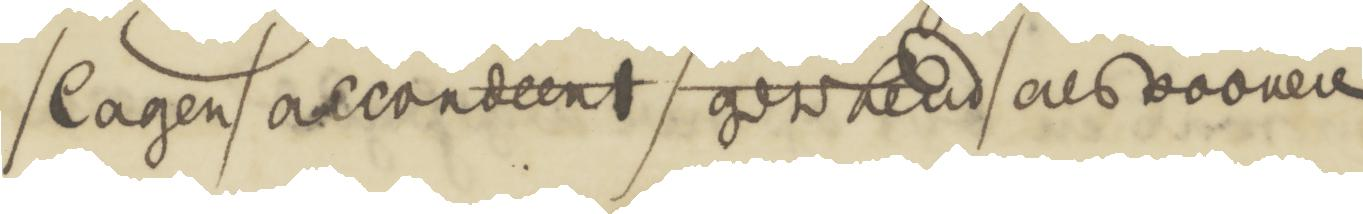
/lager/ accordeert / getekend/ als vooren
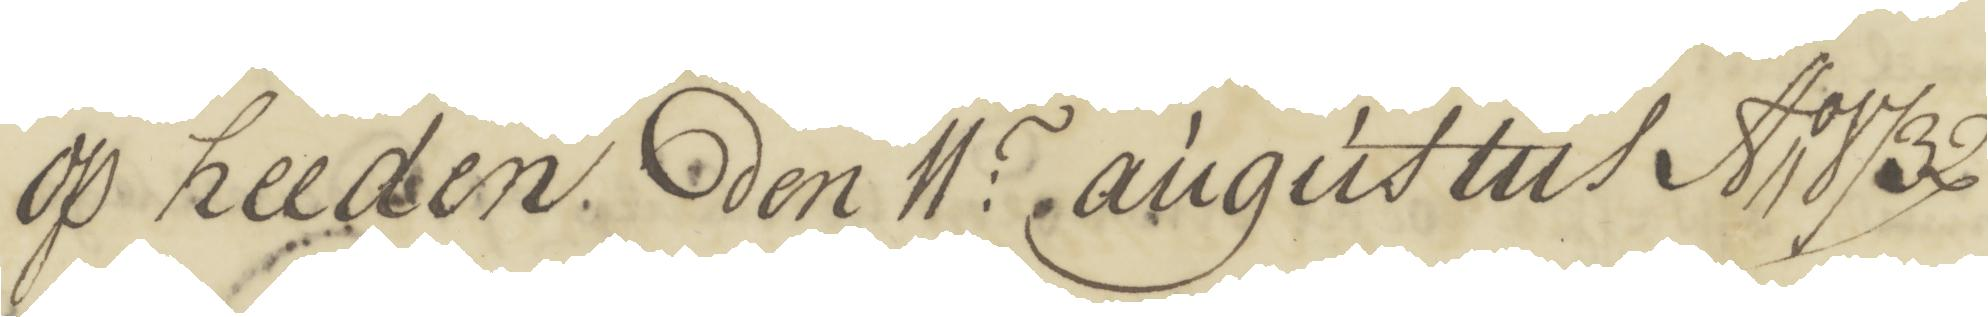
op heeden den 11:e augustus A„o 1732
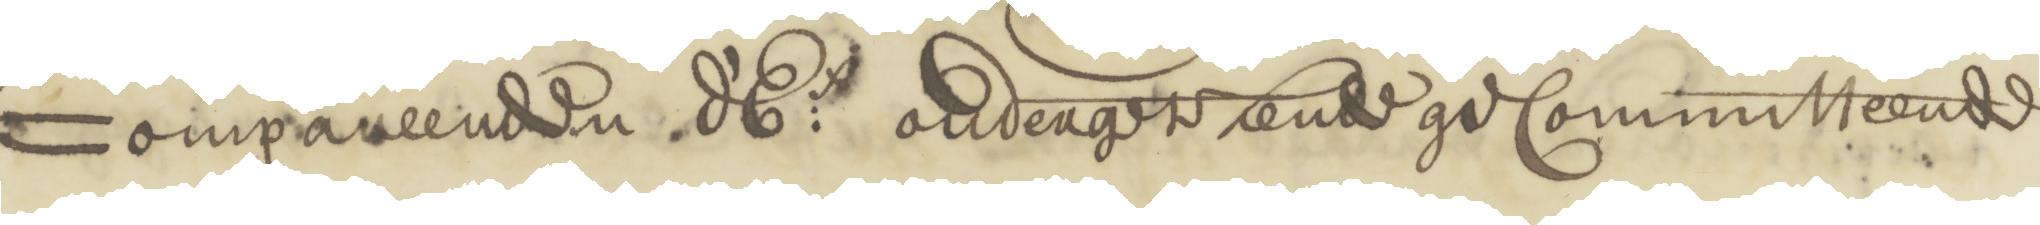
Compareerden d'E:s ondergetekende gecommitteerde
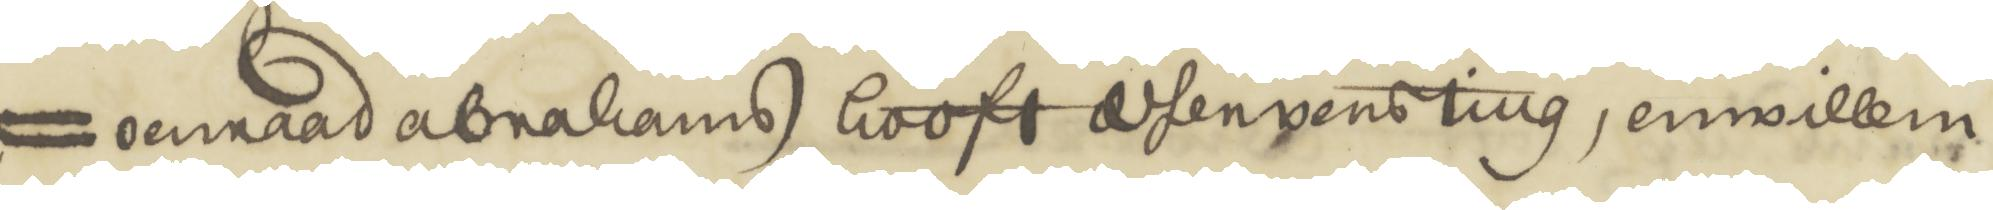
Coenraad abrahams hooft deser versting, en willem
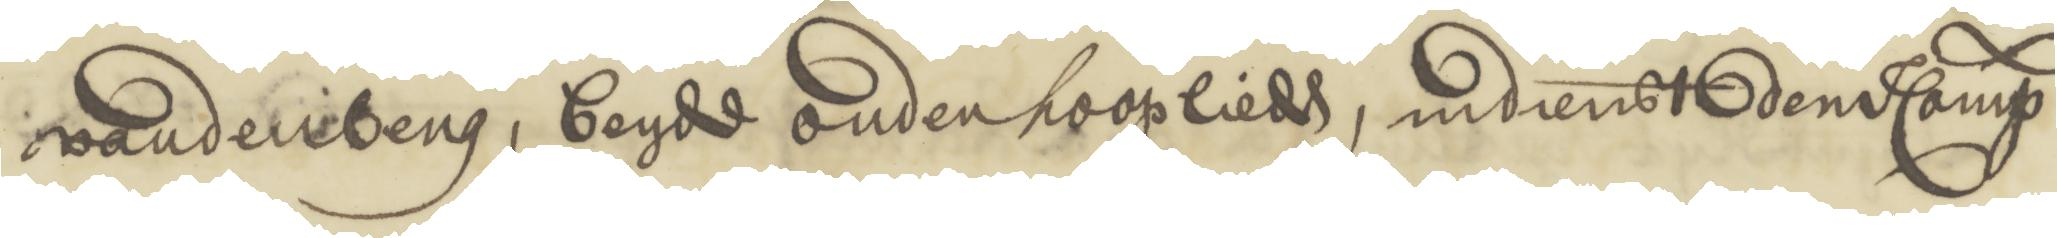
vandenberg, beyde onderkooplieden, in dienst den EComp
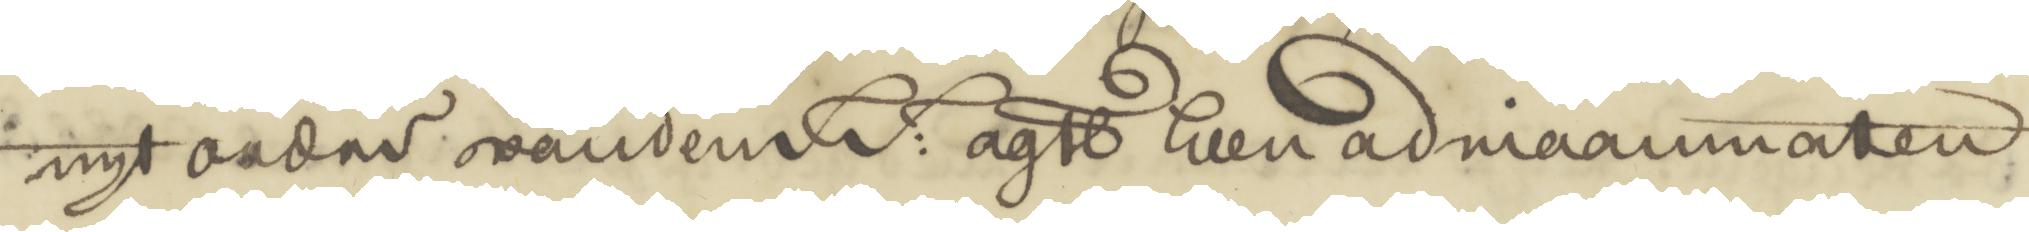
uyt ordre van den EE: agtb heer adriaan maten
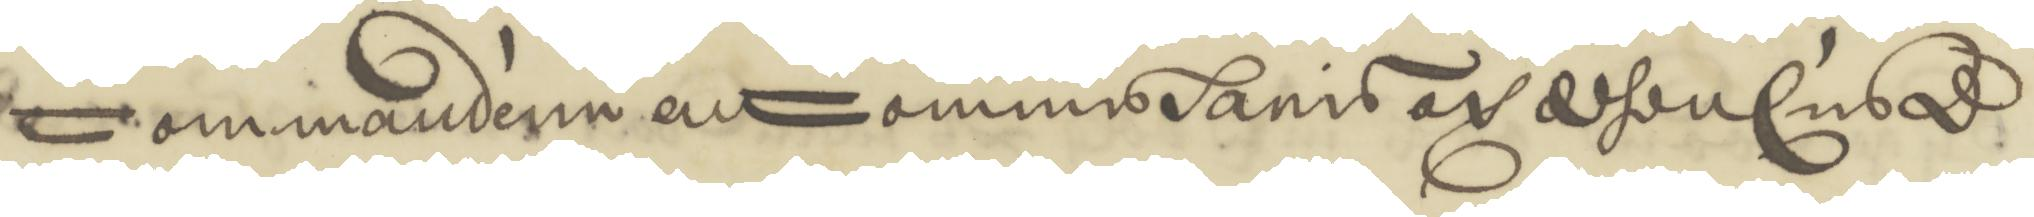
Commandeur en Commissaris over deser Custe
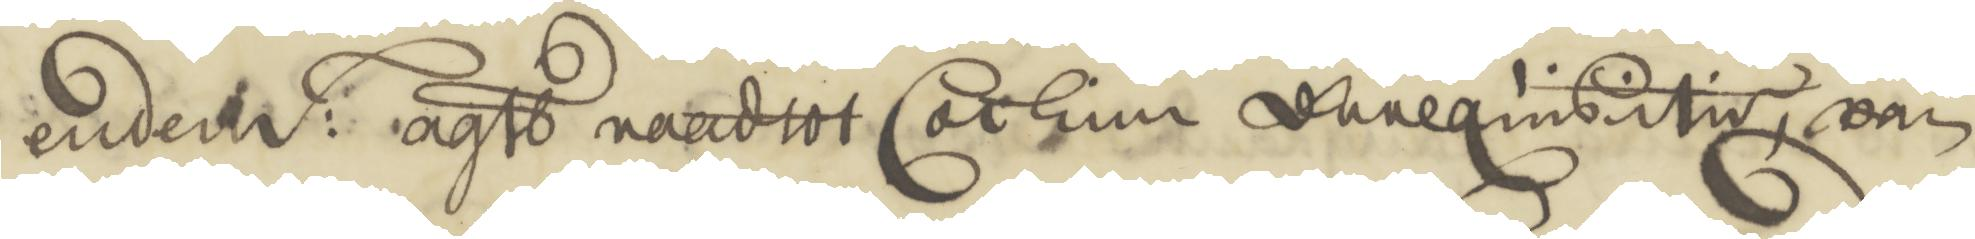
enden E: agtb raad tot Cochim Ter requisitie van
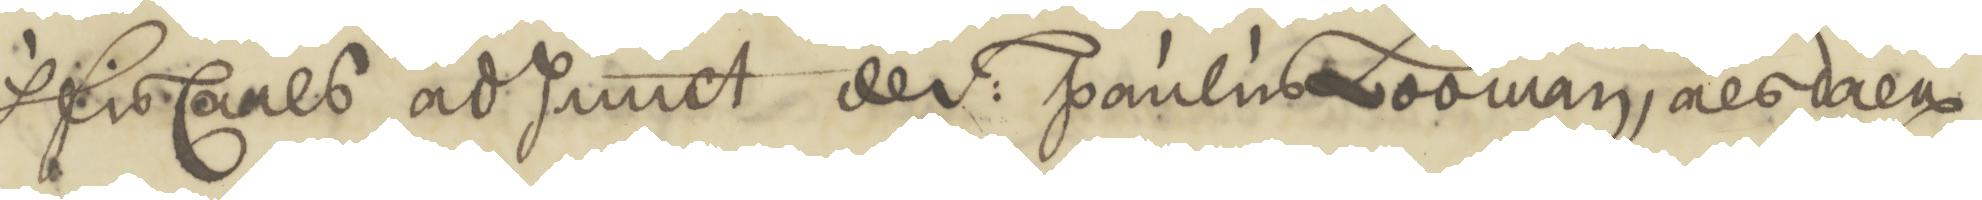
'S fiscaals adjunct de E: paulus Looman, als daer
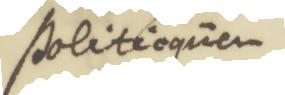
politicquen
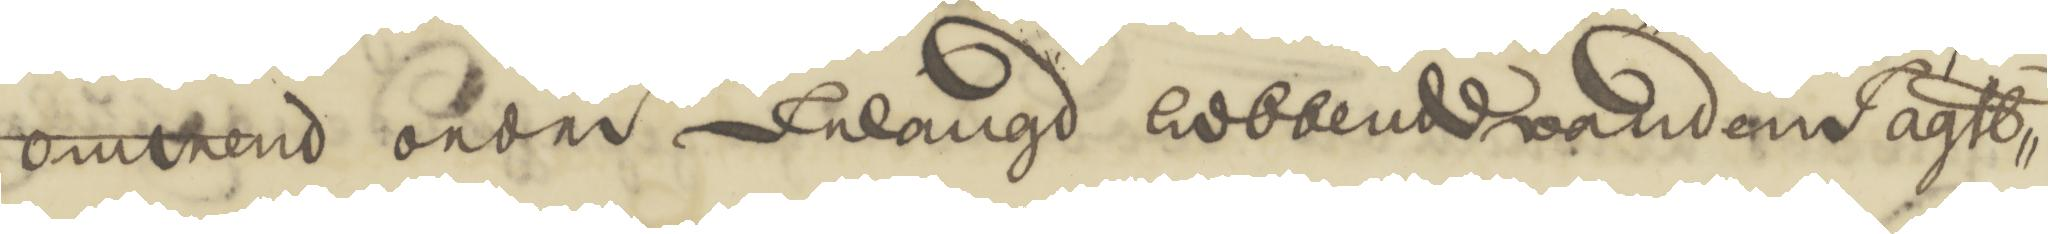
omtrend ordre Erlangd hebbende van den E agtb„
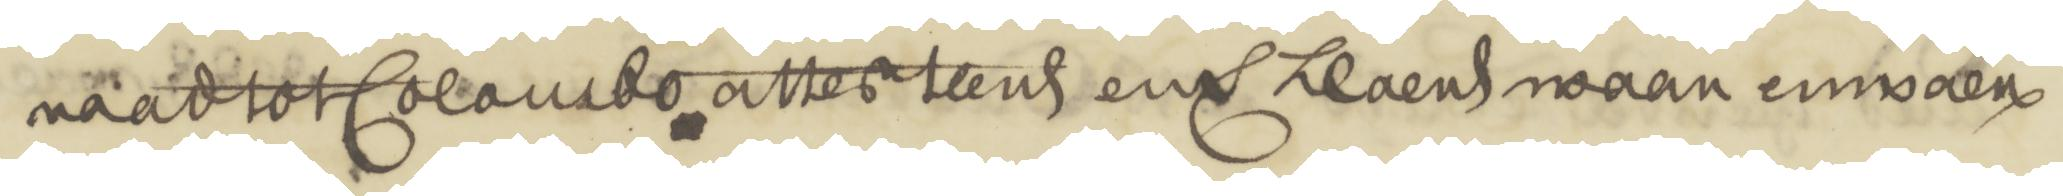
raad tot Colombo attesteeren en verklaeren waar en waer
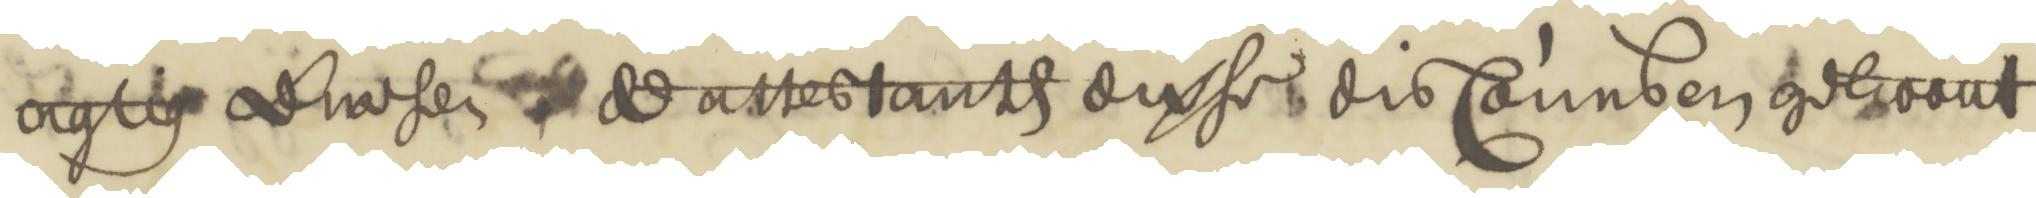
agtig tewesen de attestanten diverse discoursen gehoort
